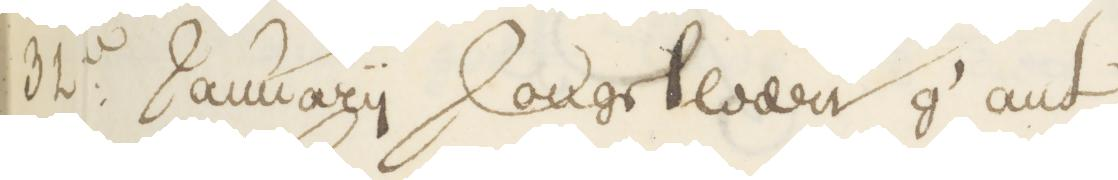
31:e Januarij Jongstleden g’ant
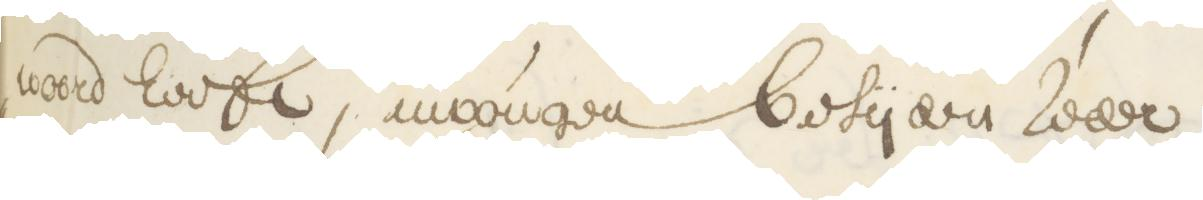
woord heeft, invougen besijden Ieder
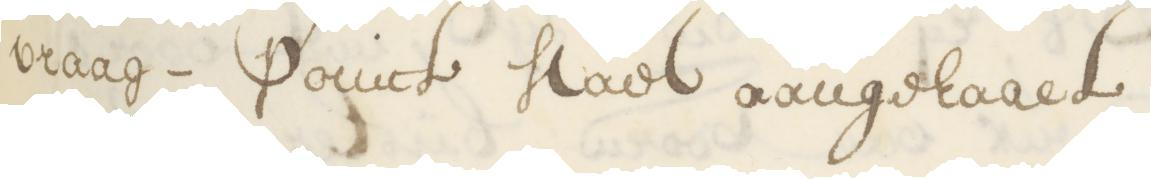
vraag-Poinct staet aangehaalt
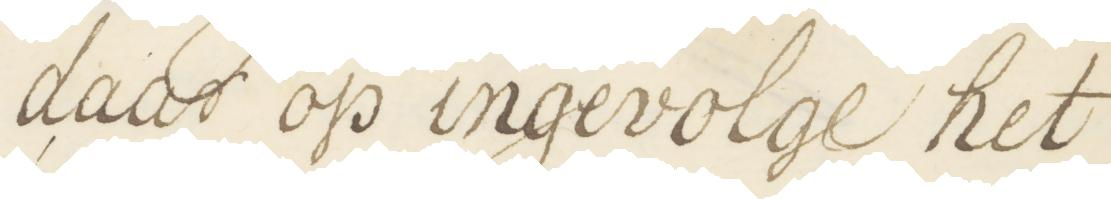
daar op ingevolge het
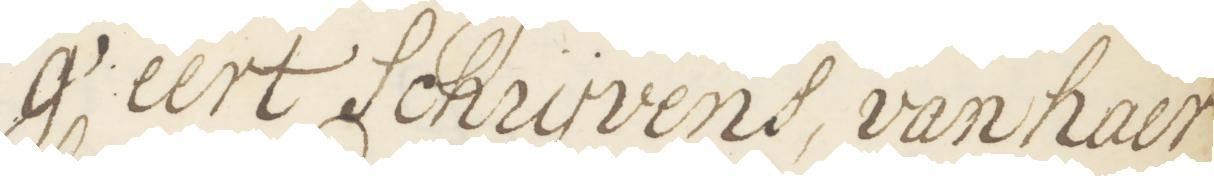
g’eert schrijvens, van haer
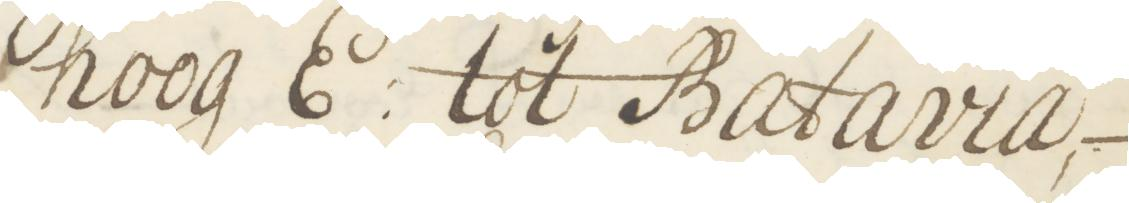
hoog E: tot Bataria,
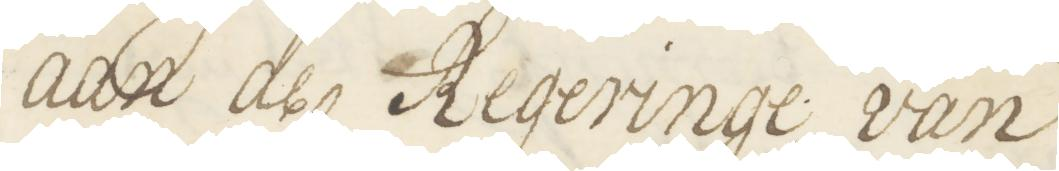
aan de Regeringe van
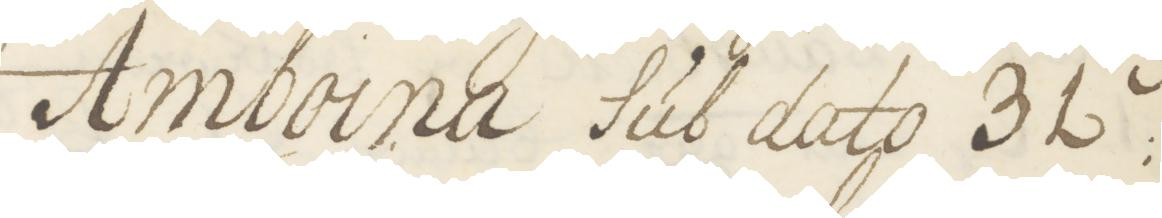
Amboina sub dato 31:e
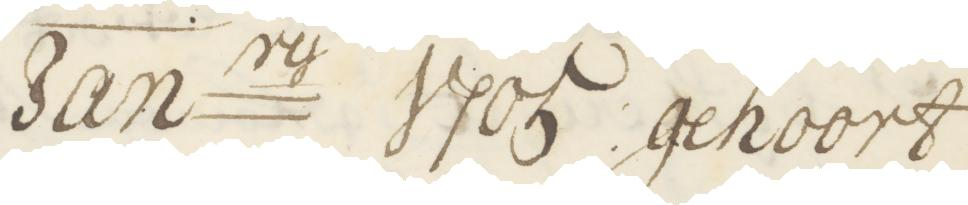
Jan=rij 1705: gehoort
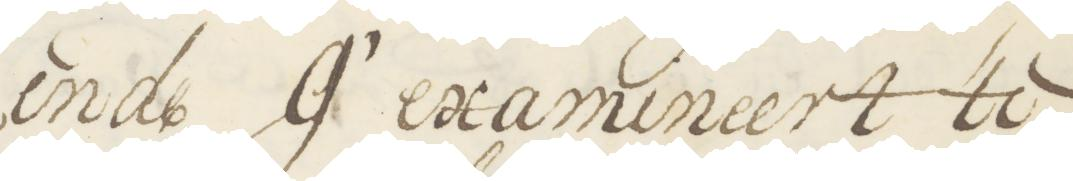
ende g’examineert te
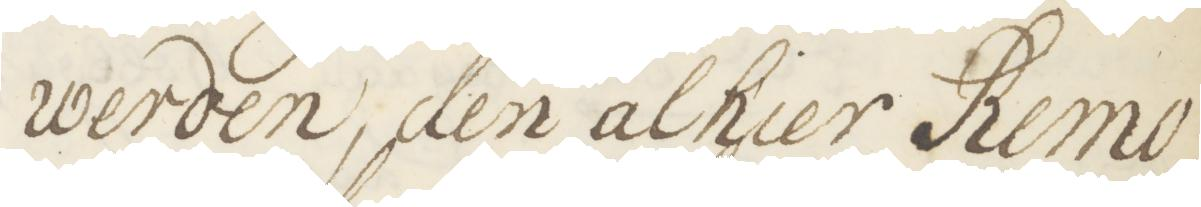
werden, den alhier Remo
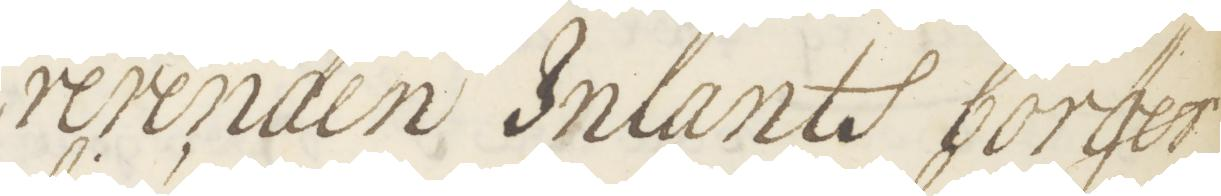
rerenden Inlants borger
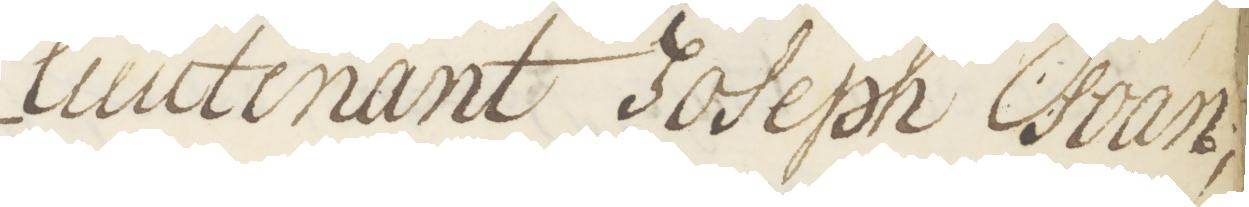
lieutenant Joseph Soan,
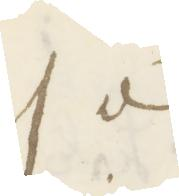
1:e
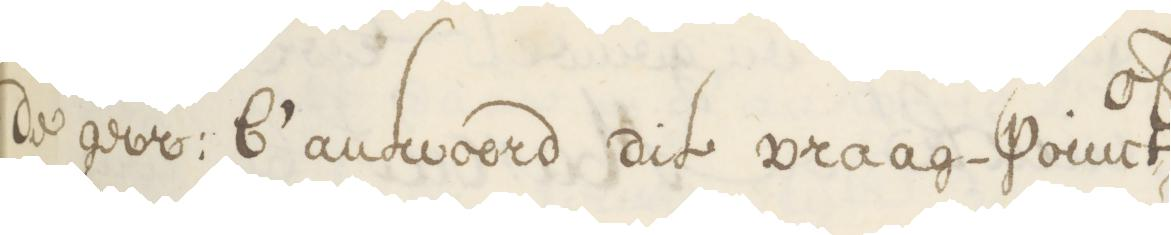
de gevr: b' antwoord die vraag-poinct
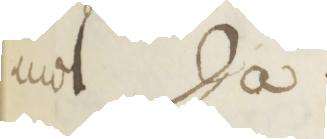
met Ja
